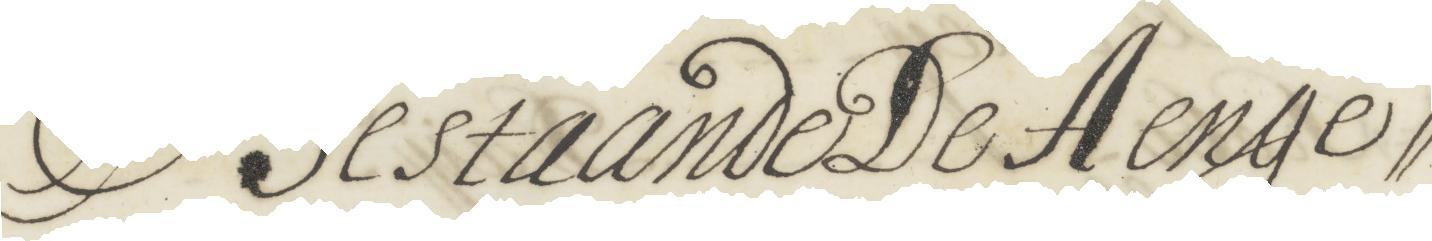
Bestaande De Aenge„
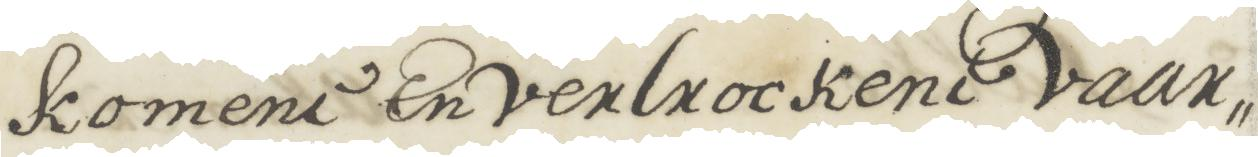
komene en vertrockene vaar„
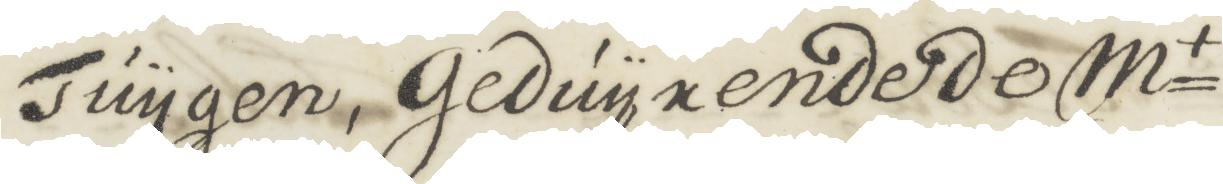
tuijgen, geduijrende de m=t
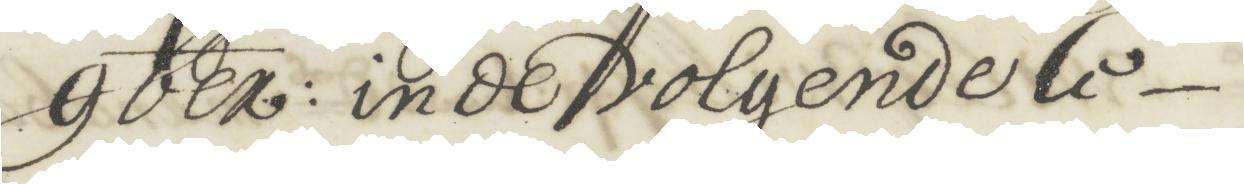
9ber: in de volgende te —
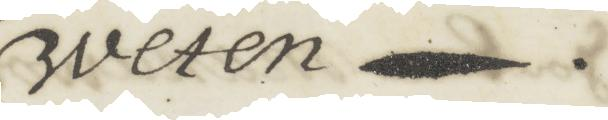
weten —.
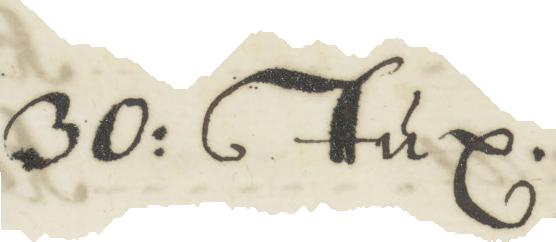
30: stux.
